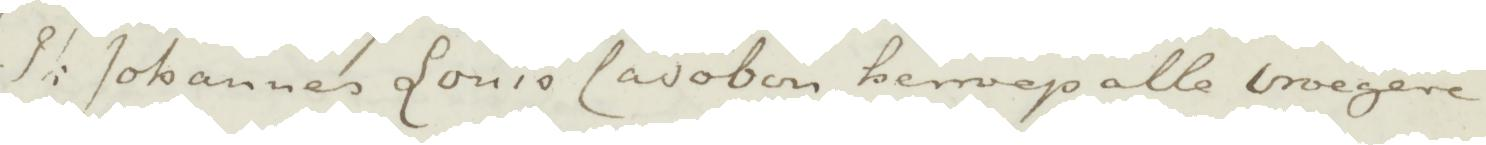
Jk Johannes Louis Casobon herroep alle vroegere
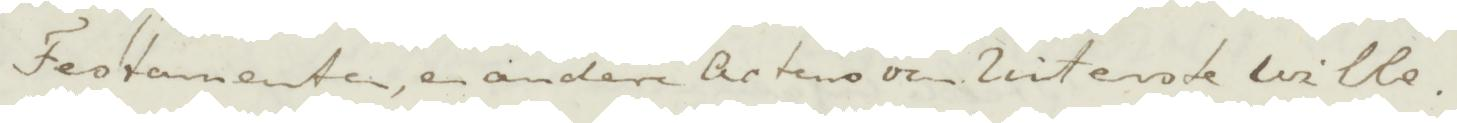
Testamenten, en andere Actens van uiterste wille.
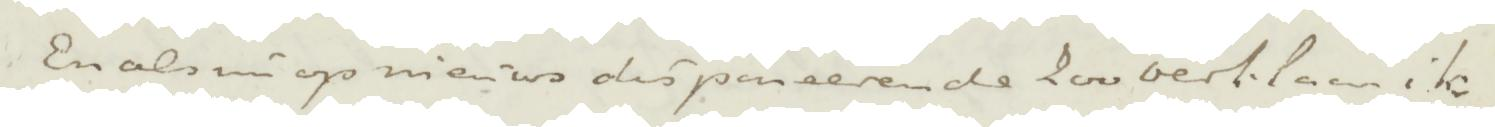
En als nu opnieuw disponeerende zoo verklaar ik
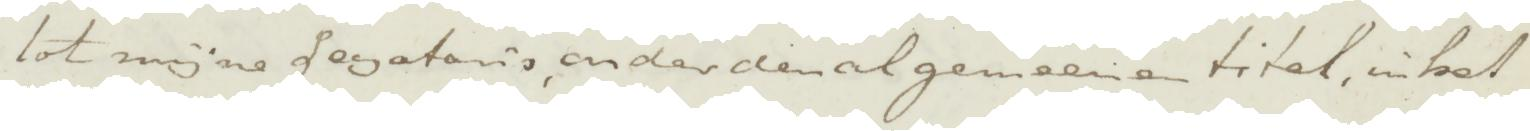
tot mijne Legetaris, onder den algemeenen titel, in het
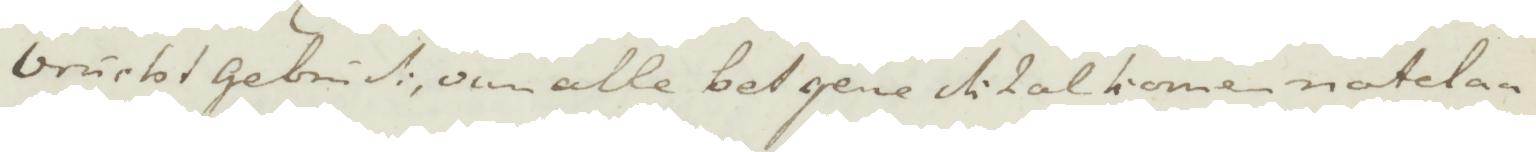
vruchtgebruik, van alle het gene ik zal komen natelaa
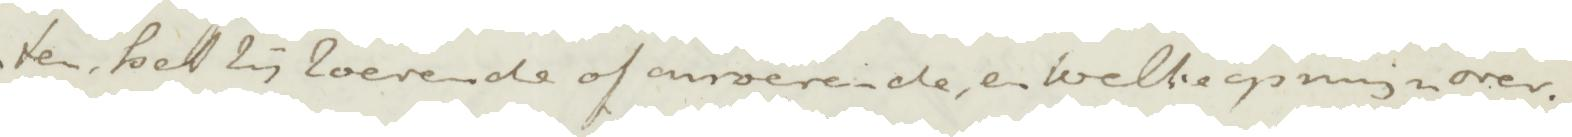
ten, het zij roerende of onroerende, en welke op mijn over,
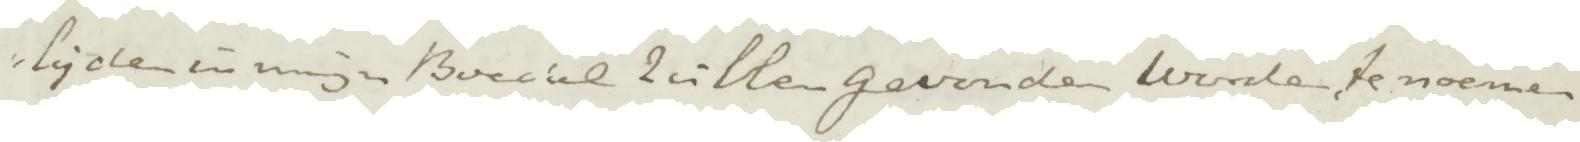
„lijden in mijn Boedel zullen gevonden worden, te noemen
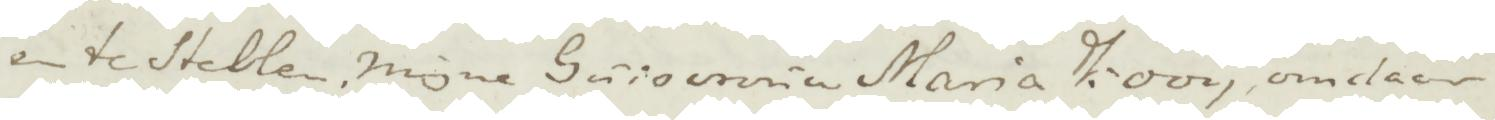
en te stellen, mijne huisvrouw Maria Kooij, om daar
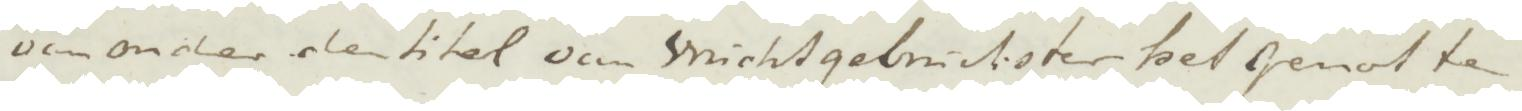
van onder den titel van vruchtgebruikster het Genot te
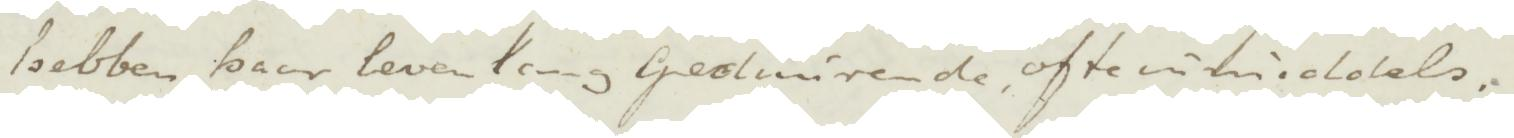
hebben haar leven lang Geduurende, ofte in middels,
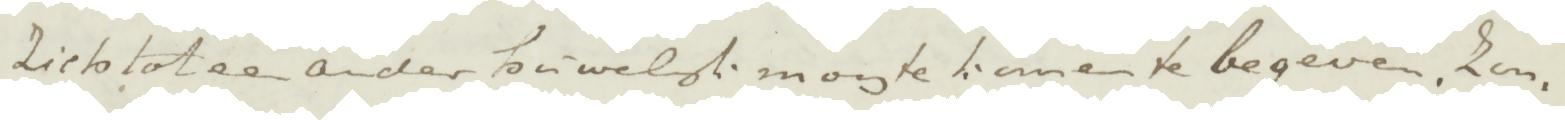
zich tot een ander huwelyk mogte komen te begeven, zon„
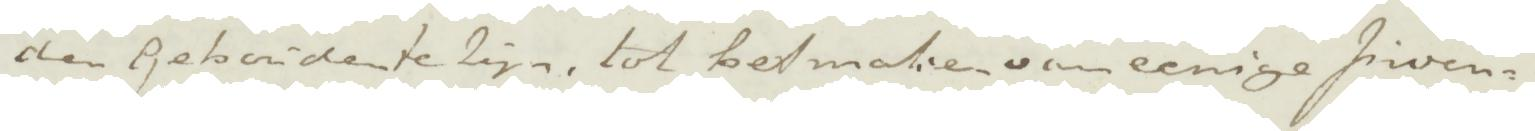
der Gehouden te zijn, tot het maken van eenige Jnven=
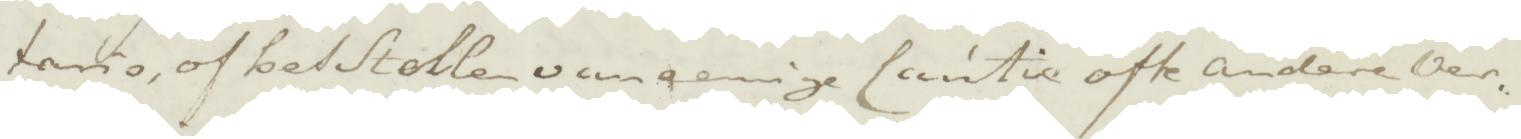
taris, of het stellen van eenige Cautie ofte andere ver„
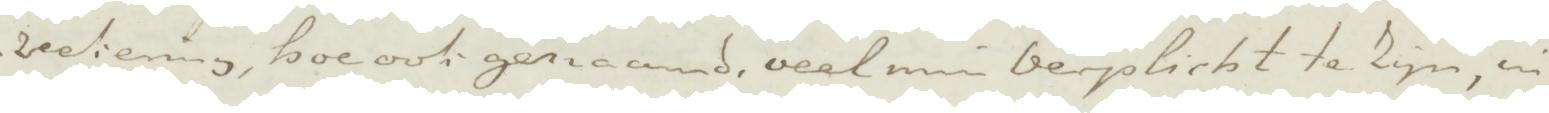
„reekering, hoe ook genaamd, veel min verplicht te zijn, in
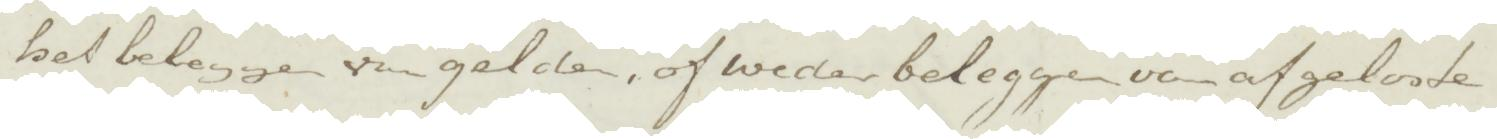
het beleggen van gelden, of weder beleggen van afgeloste
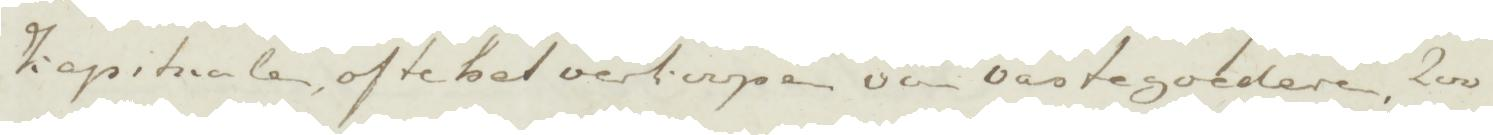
Kapitaalen, of te het verkoopen van vaste goederen, zoo
